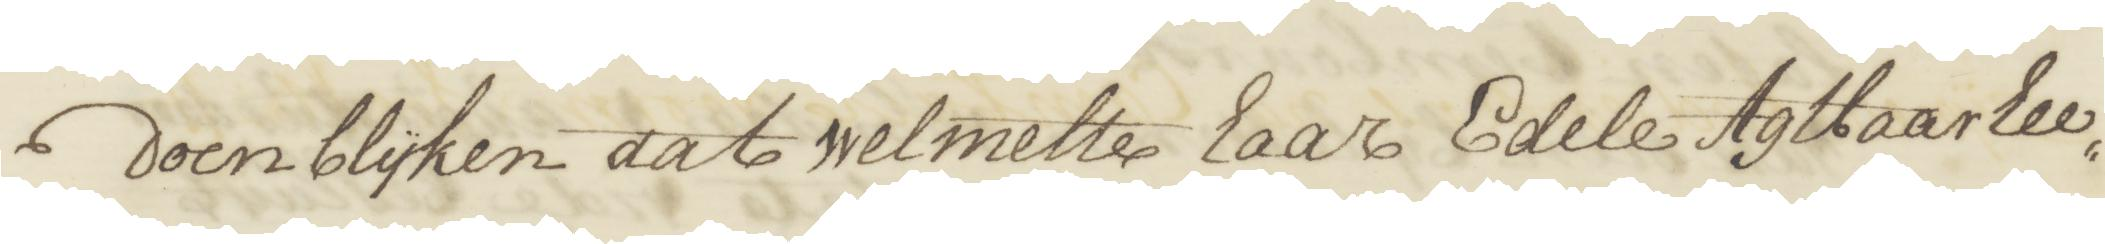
doen blijken dat welmelte haar Edele Agtbaarhee„
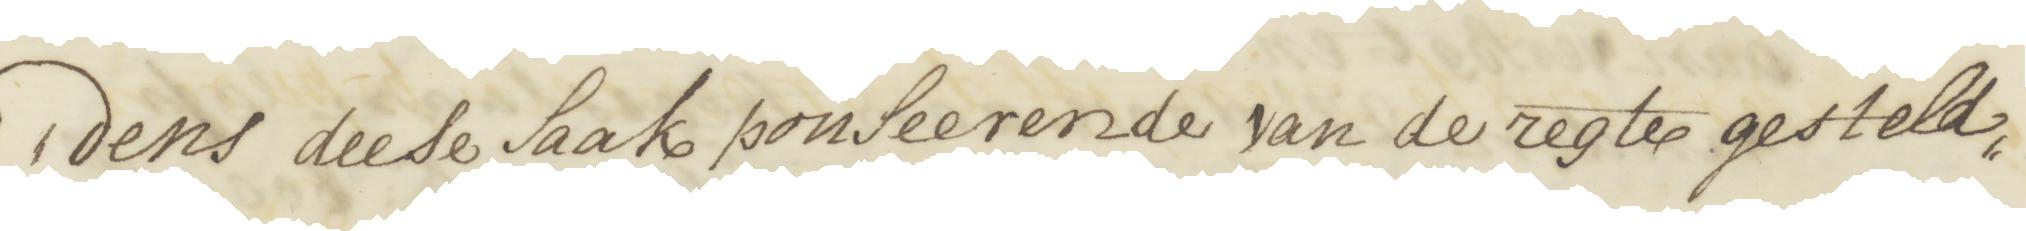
„dens deese saak pouseerende van de regte gesteld„
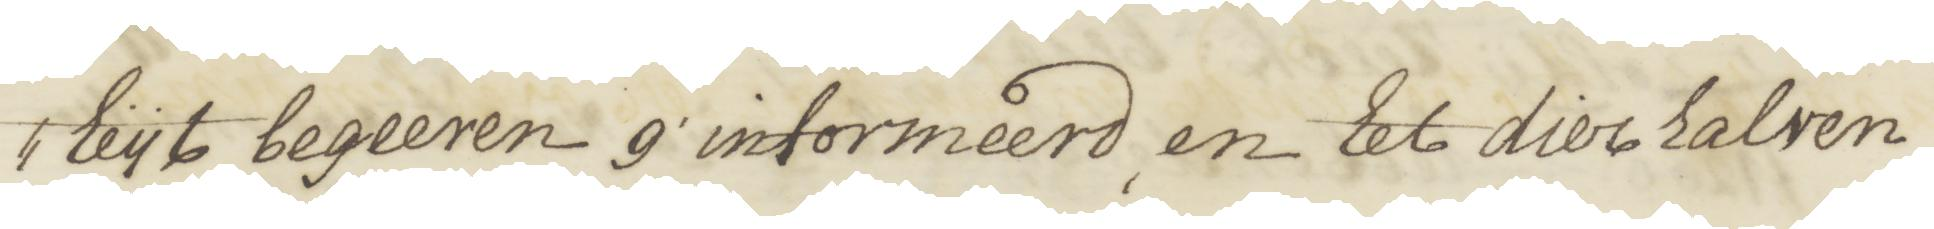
„heijt begeeren g’informeerd, en het dier halven
